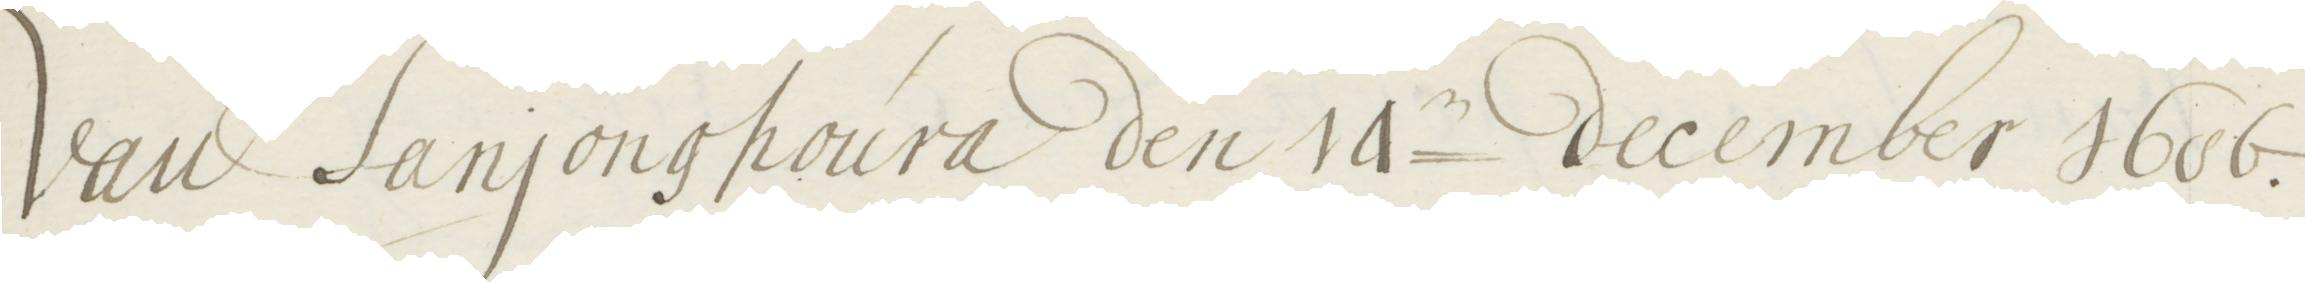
Van Tanjongpoura den 14=' december 1686. —
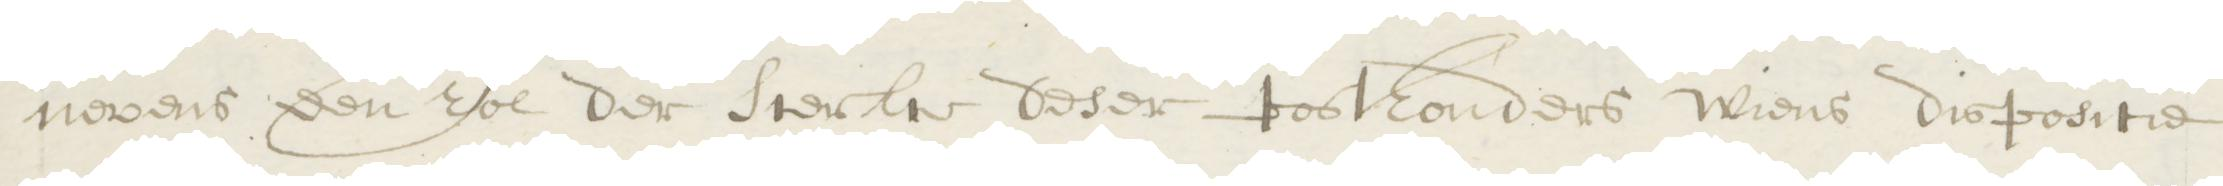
nevens een rol der sterkte deser posthouders wiens dispositie
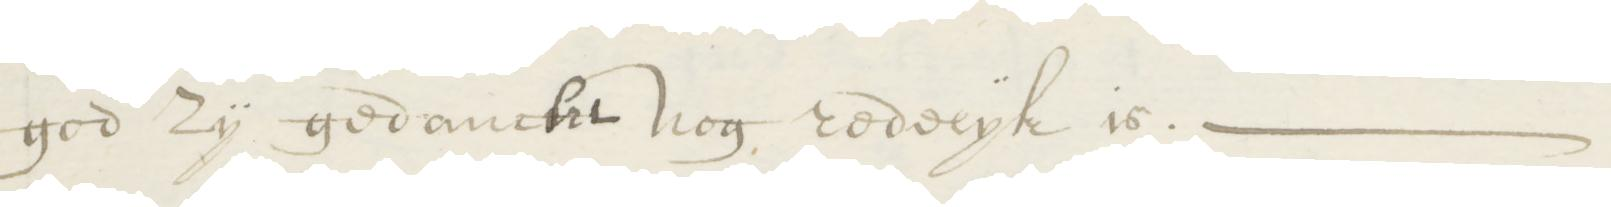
god zij gedanckt nog redelijk is. —
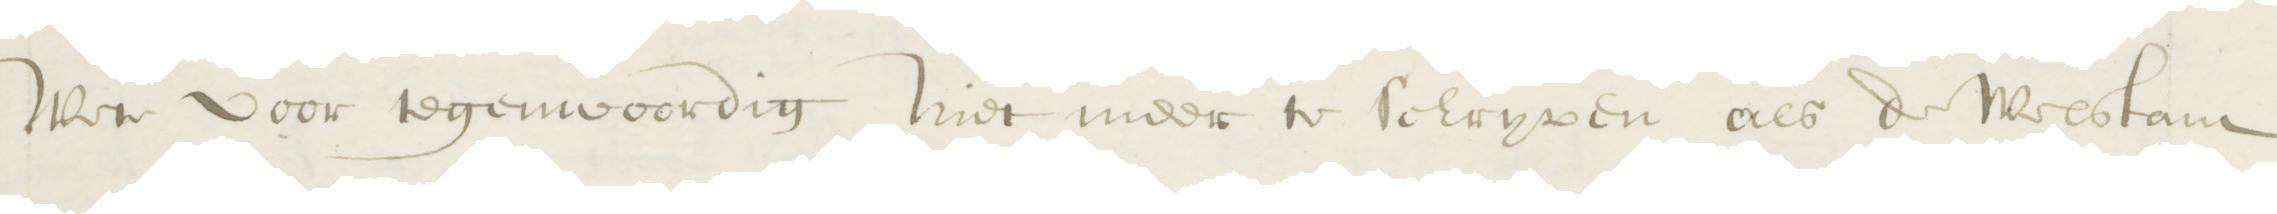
wete voor tegenwoordig niet meer te schrijven als de toestant
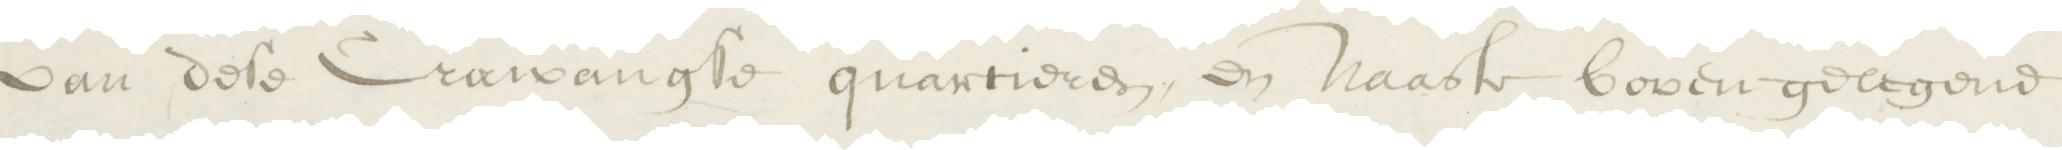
van dese Crawangse quartieren, en naaste boven gelegene
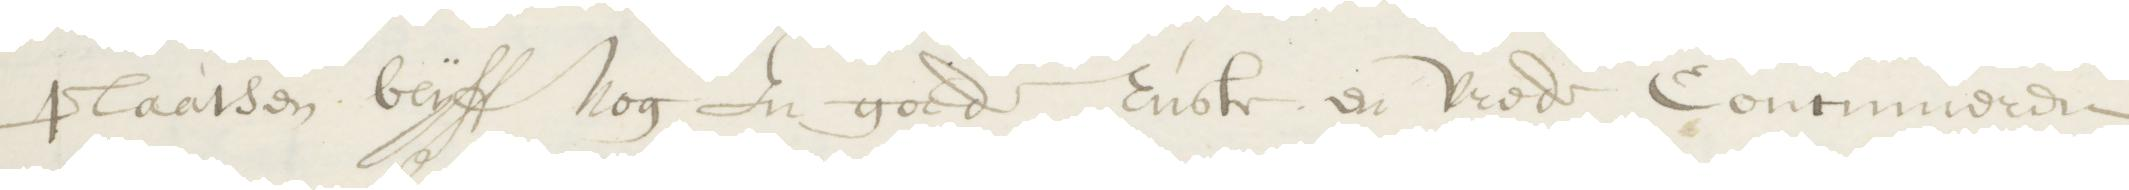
plaatsen blijff nog in goede ruste en vrede Continueren
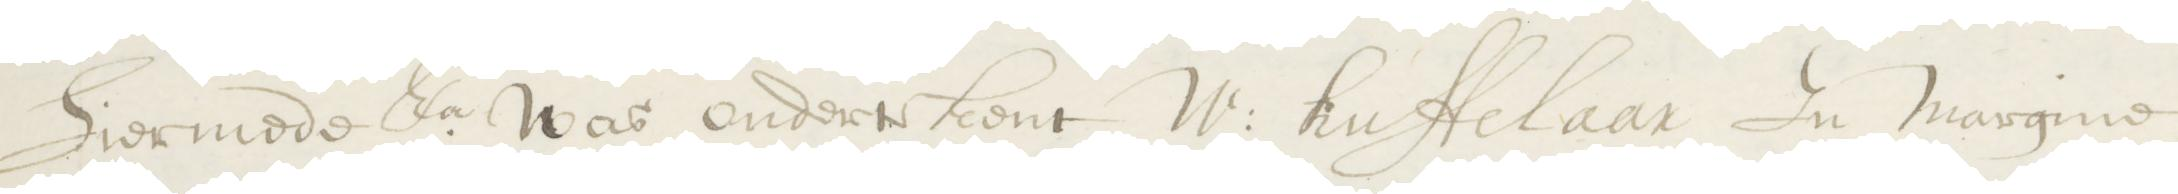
hier mede etc.a was ondertekent W: kuffelaar in margine
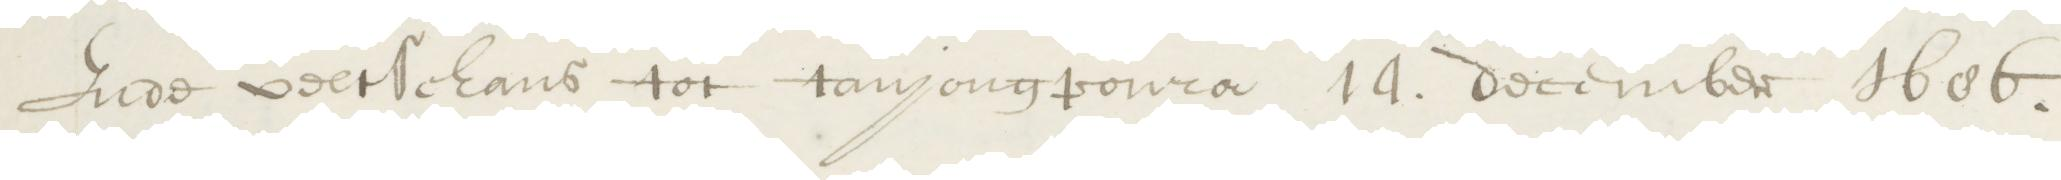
Inde veltschans tot tanjongpoura 14. december 1686.
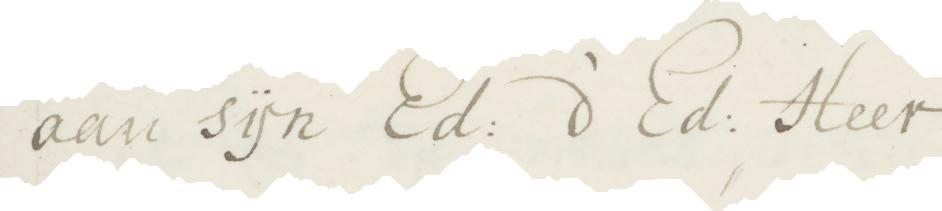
aan sijn Ed: d' Ed: Heer
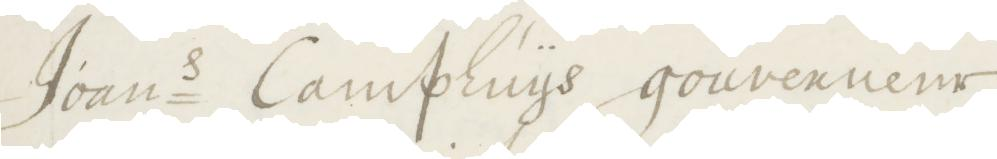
Joan=s Camphuijs gouverneur
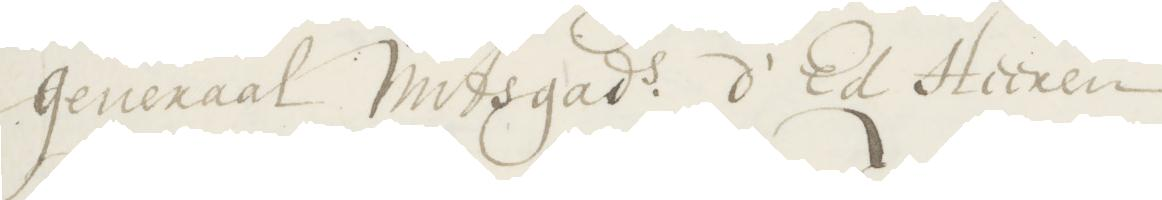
generaal mitsgad:s d’ Ed Heeren
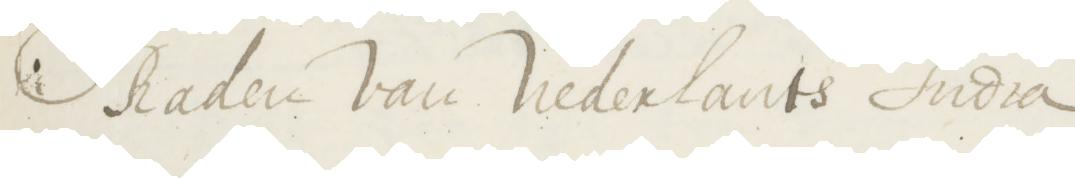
Raden van Nederlants India
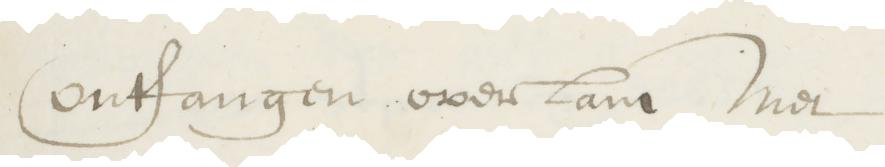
ontfangen overlant met
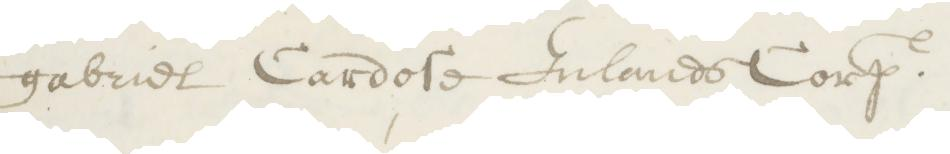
gabriel Cardose Inlands Corp.l
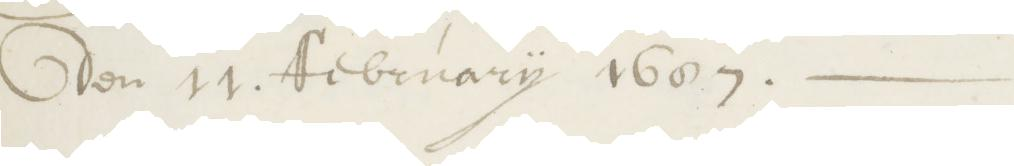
den 11. februarij 1687. —
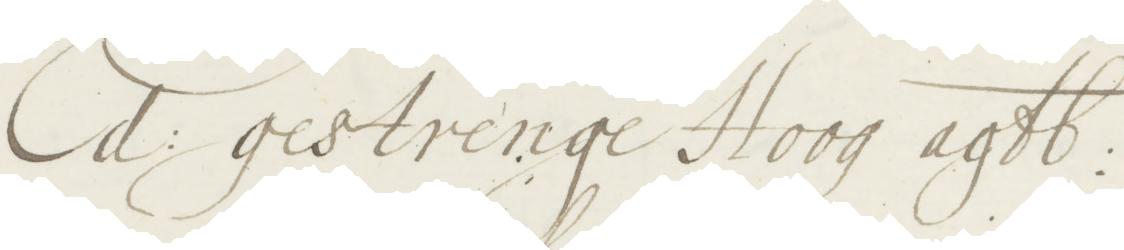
Ed: gestrenge Hoog agtb:
